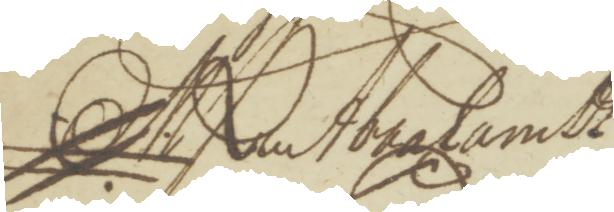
# M van Abrahams
